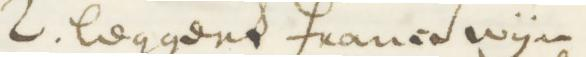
2. leggers france wijn
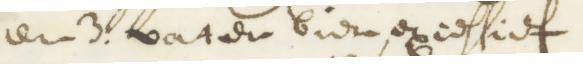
en 3. vater bien, excessief
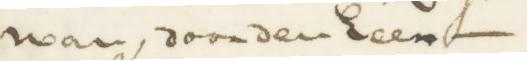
wan, door den heer —
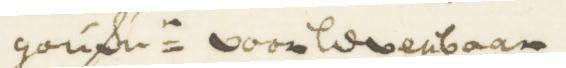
gouvern=r voor levenbaar
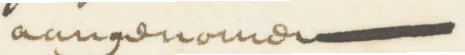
aangenomen
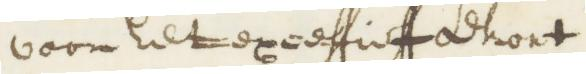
voor het excessieff te kort
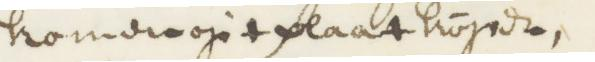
komen op ’t plaat koper,
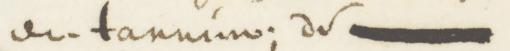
en tarruw; de
